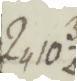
2„10¾
